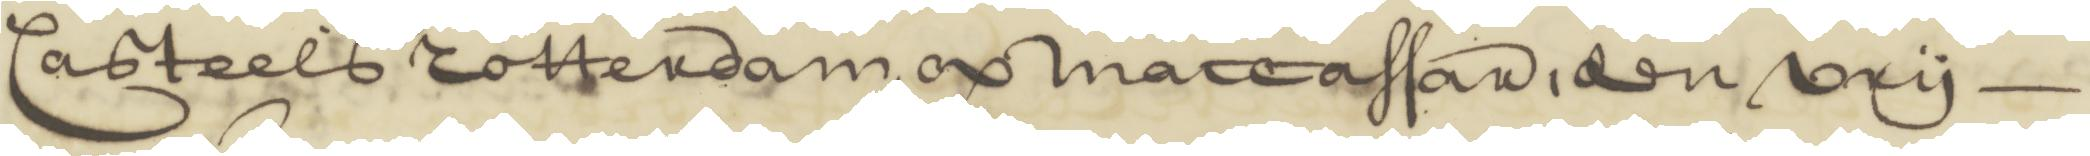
Casteels rotterdam op maccassar, den vrij—
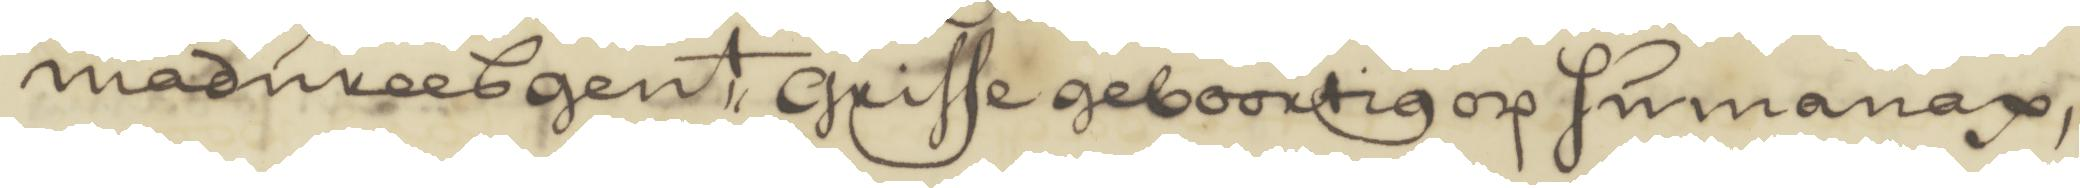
madurees gen„t grisse geboortig op sumanap,
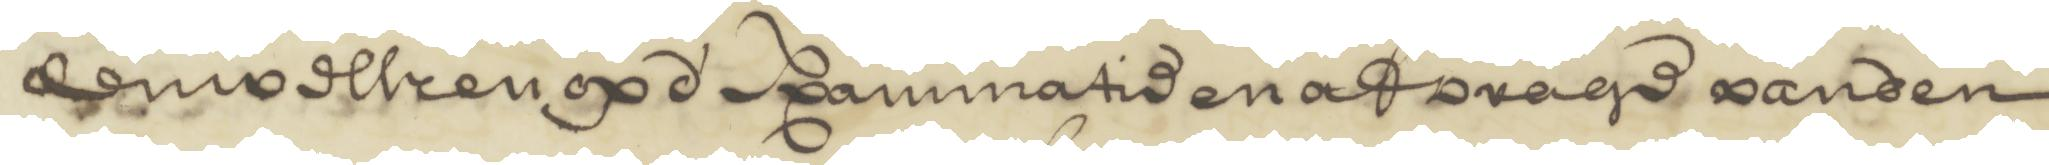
denwelken op d’Examinatie en afvrage vanden
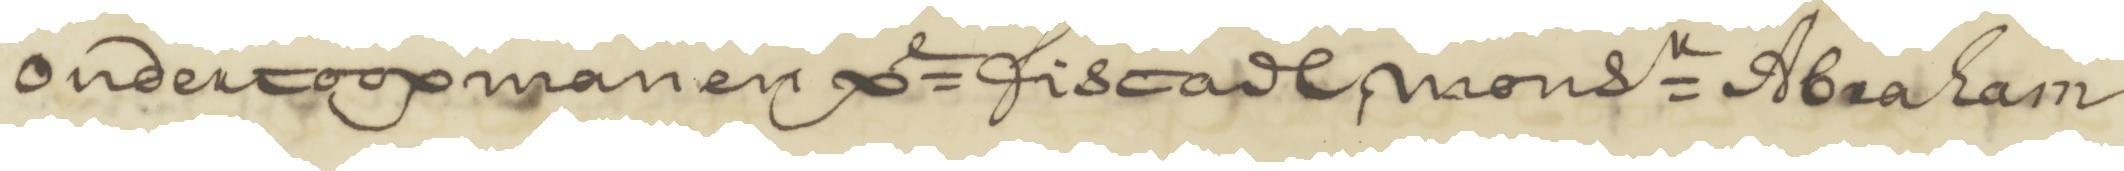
ondercoopman en p=l fiscael, mons=r Abraham
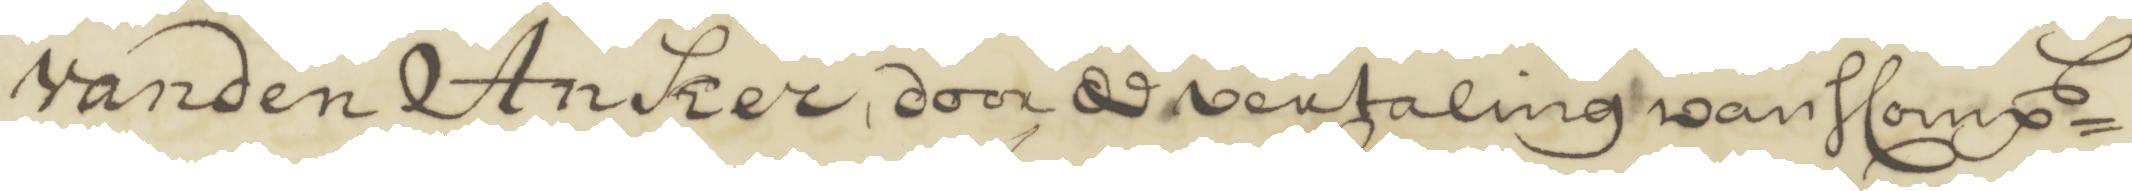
vanden Anker, door de vertaling van scomp=s
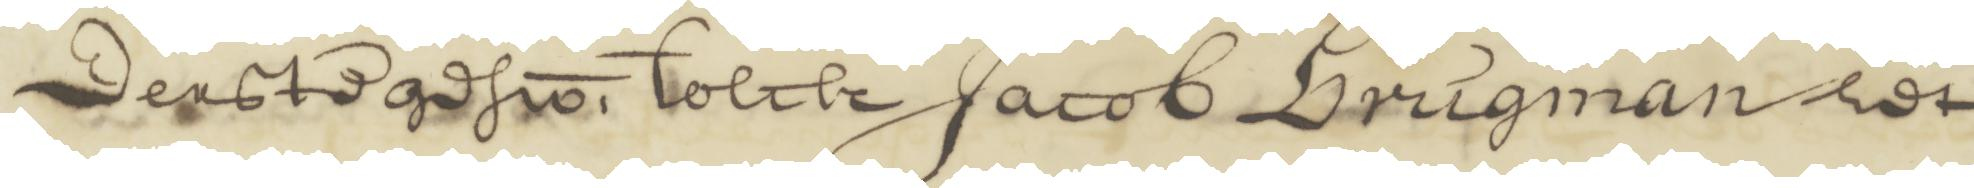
Eerste gesw: tolck Jacob Brugman het
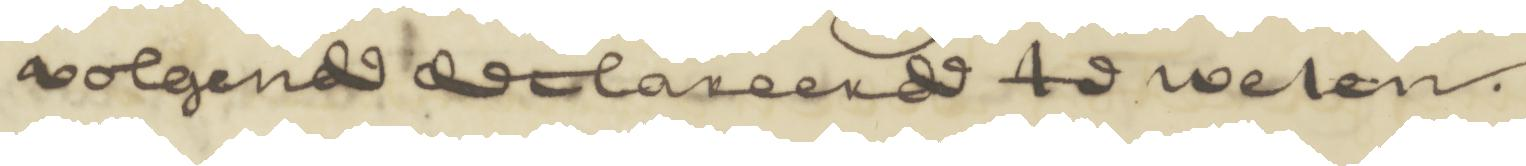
volgende declareerde te weten.
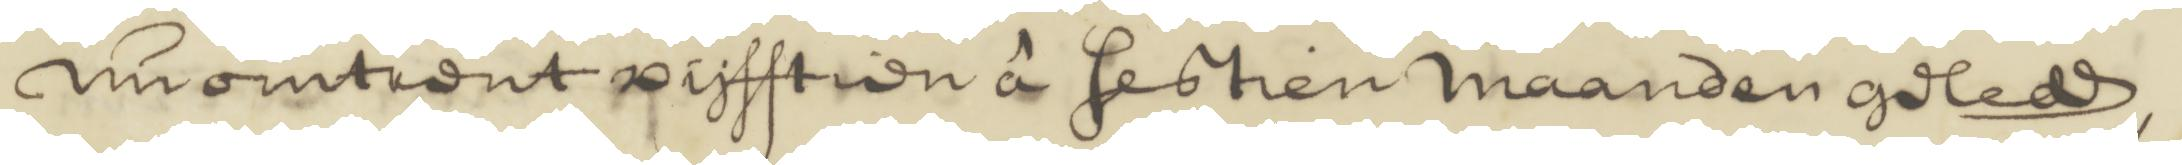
nu omtrent vijfftien â sestien maanden geleden,
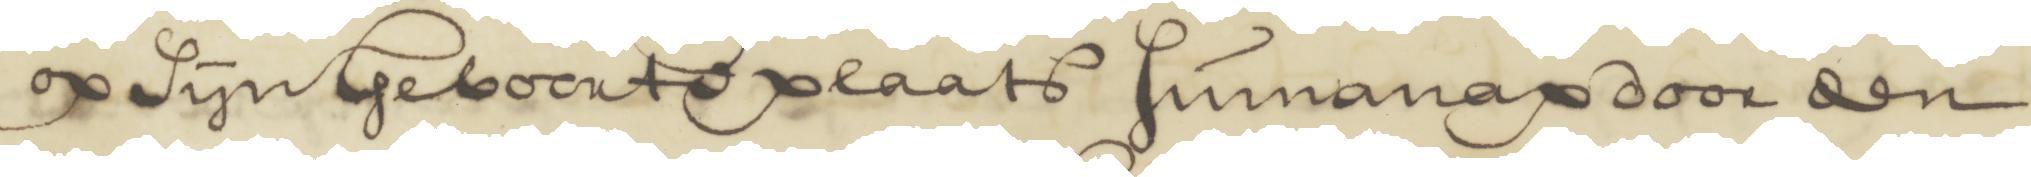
op sijn Geboorte plaats sumanap door den
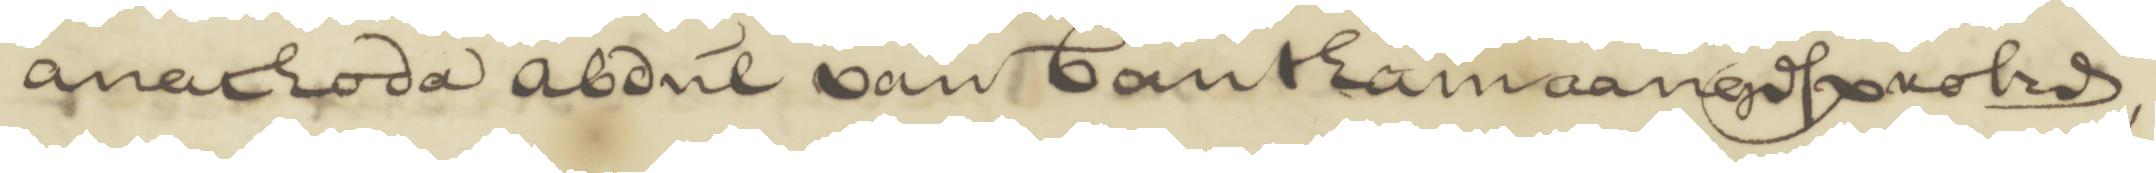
anachoda abdul van bantham aangesproken,
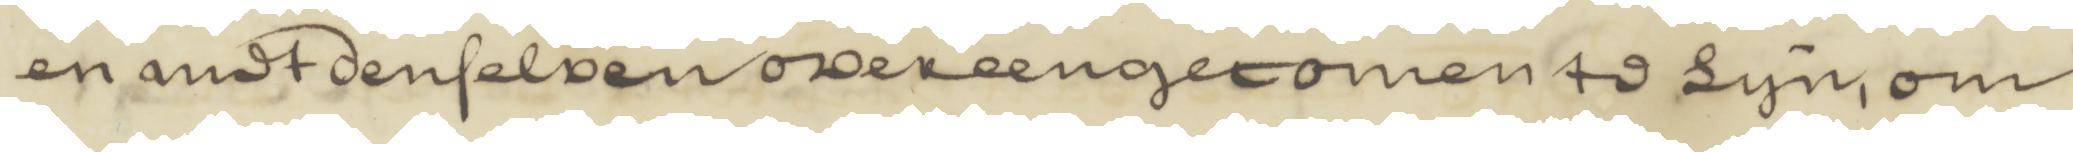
en met denselven overeengecomen te zijn, om
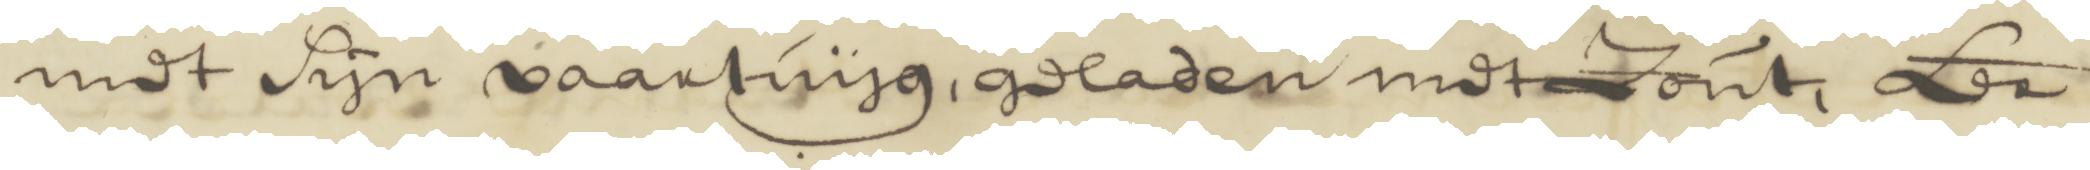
met sijn vaartuijg, geladen met zout, ter
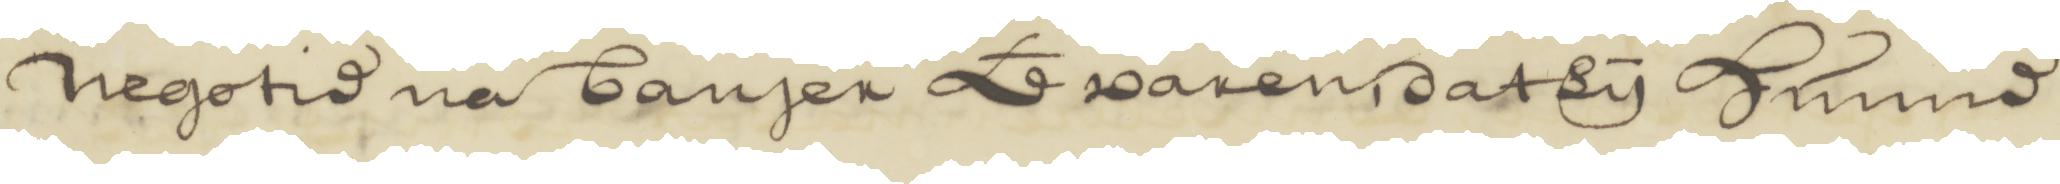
negotie na banjer te varen, dat hij hunne
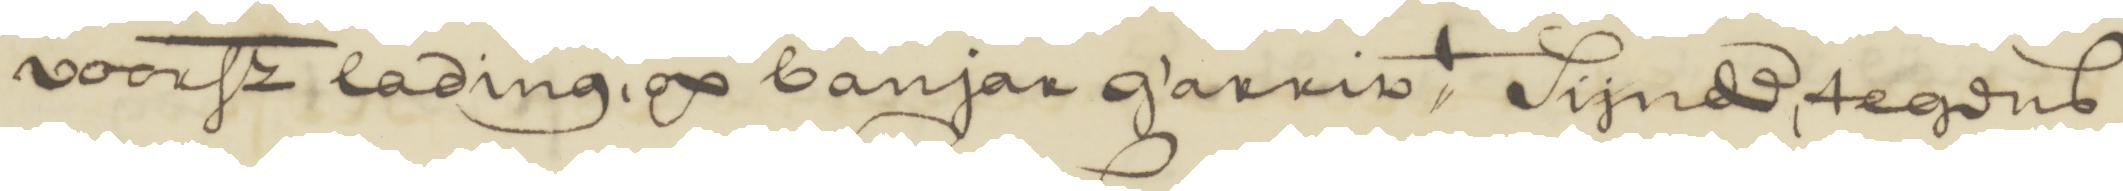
voorsz lading, op banjar g'arriv„t sijnde, tegens
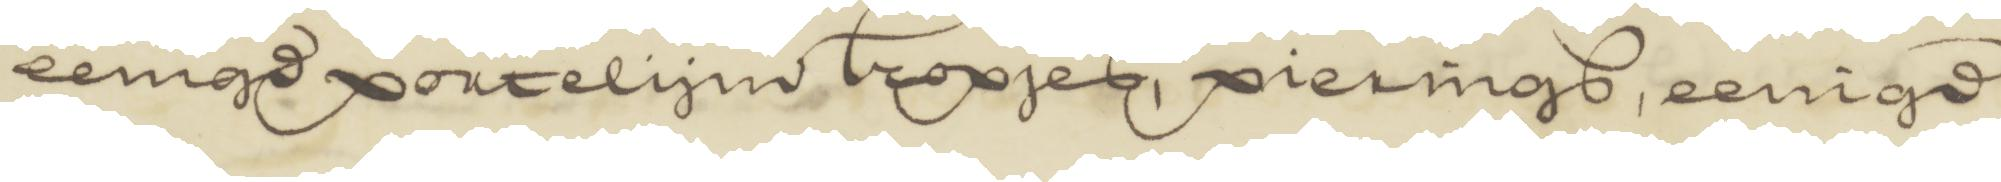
eenige porcelijne kopjes, pierings, eenige
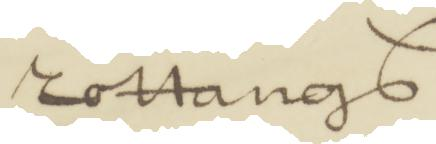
rottangs
